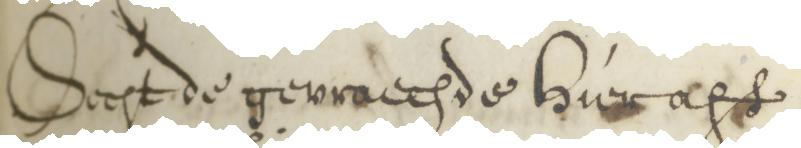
Sogt de gevraechde hier aft
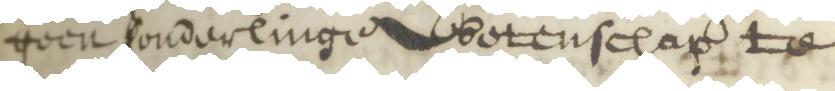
geen sonderlinge wetenschap te
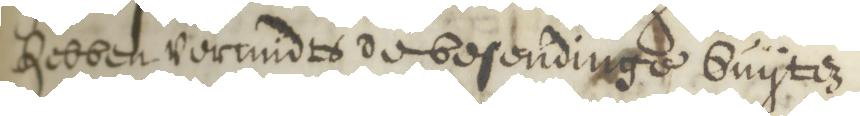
hebben vermidts debesendinge buijten
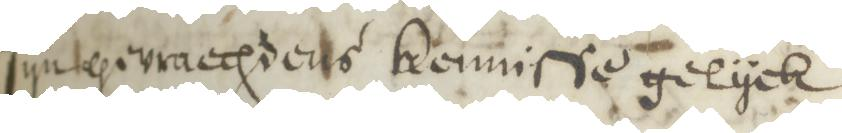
sijn gevraechdens kenniste gelijck
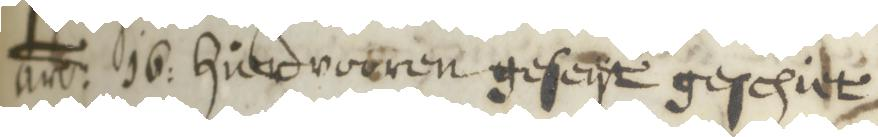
art: 16: hier vooren geseijt geschiet
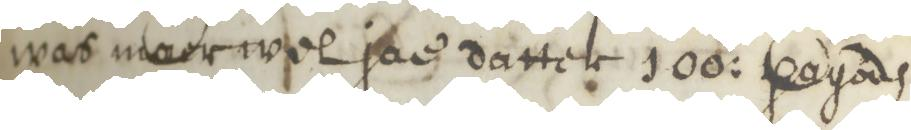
was maer weljae datter 100: pagoden
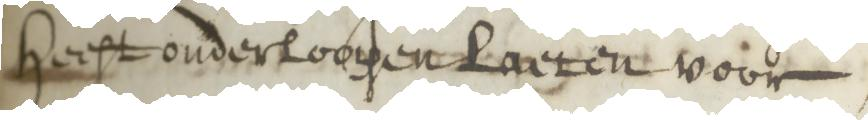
heeft onderloopen laeten voor
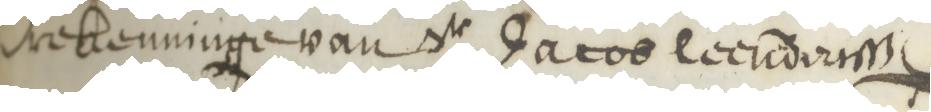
rekenninge van s„r Jacob leendertsz
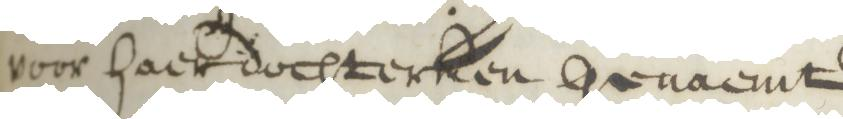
voor haer dochterken genaemt
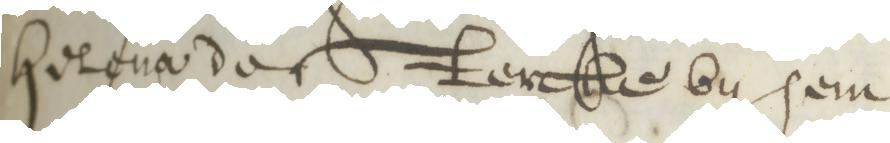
helena destercke bij hem
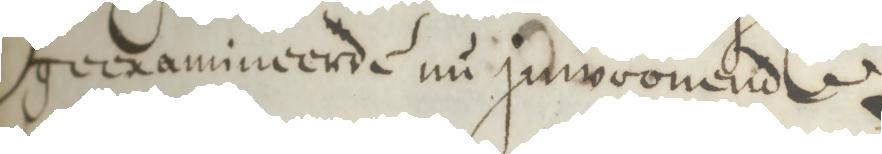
geexamineerde nu jnwoonende
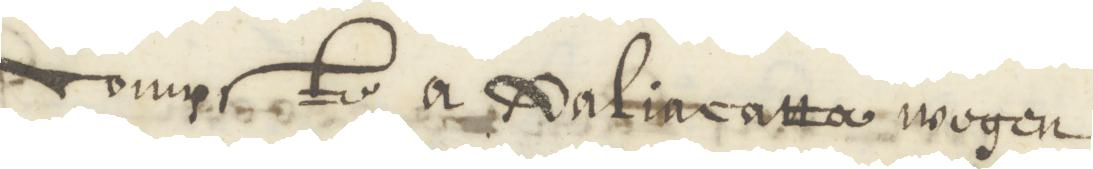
compste a paliacatta wegen
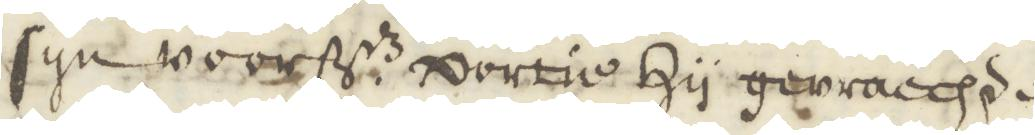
sijn voorsz„en portie hij gevraechde
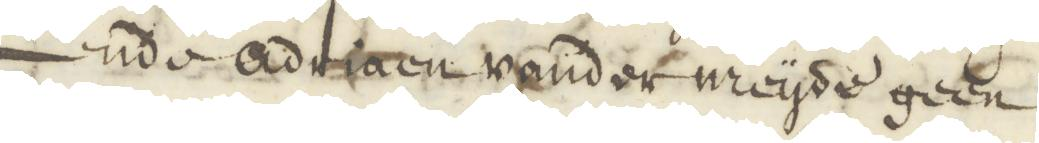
ende adriaen vander meijde geen
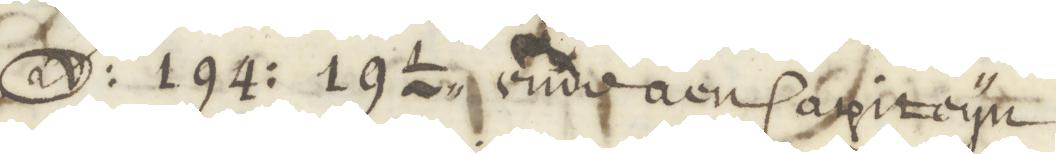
R:a 194: 19½„ ende aen Capiteijn
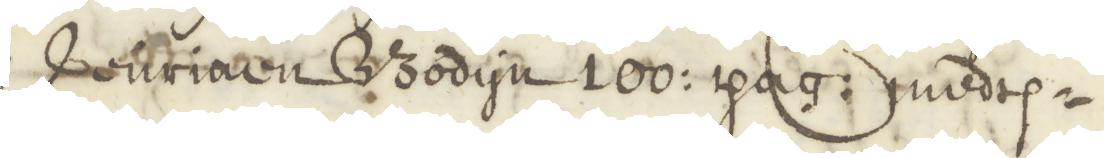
Jouriaen Wodijn 100: pag: medts=
